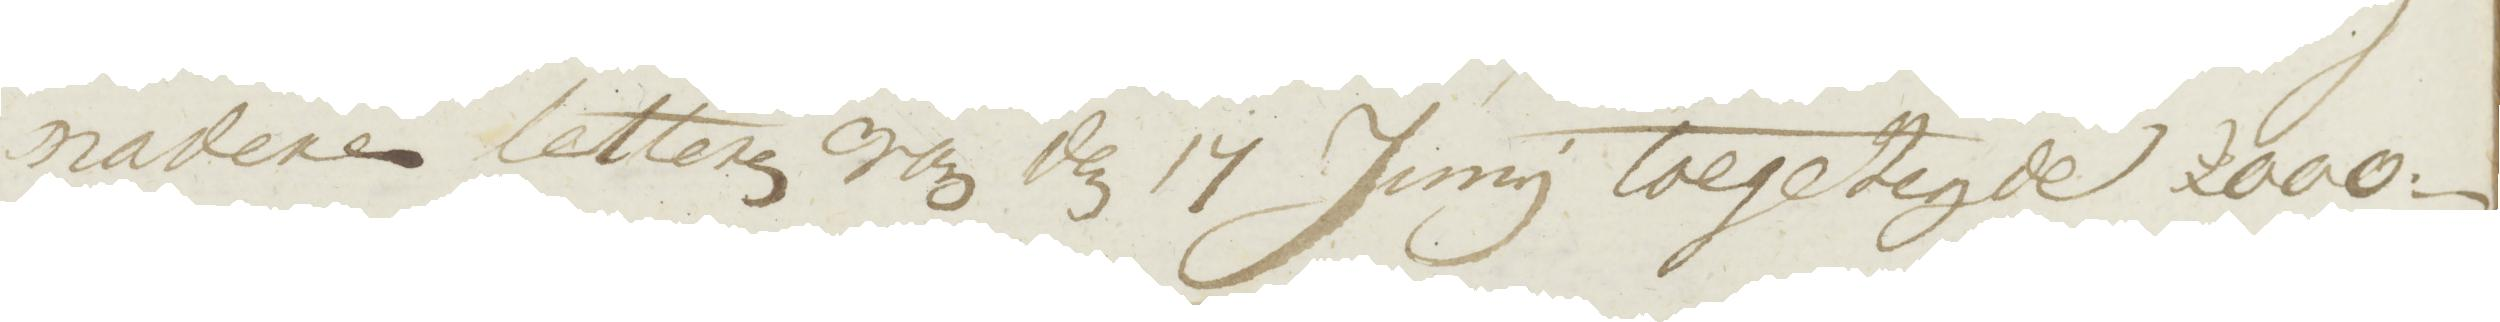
nadere letteren van den 17 Junij toegezegde 2000.—
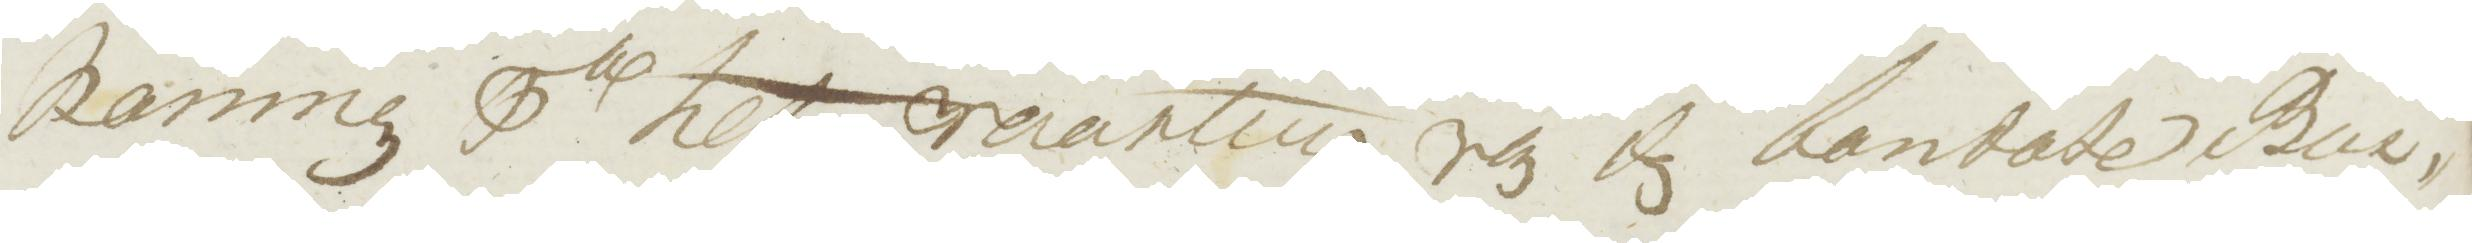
kannen p„r het vaartuig van den bandase Bur„
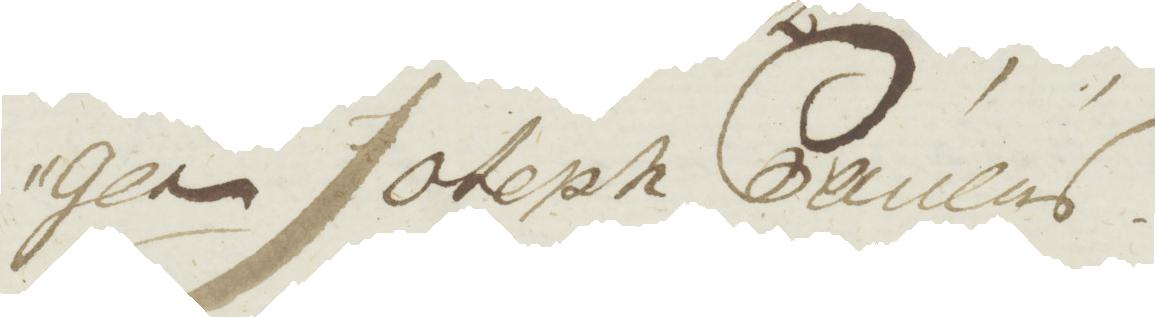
„ger Joseph Cauers.
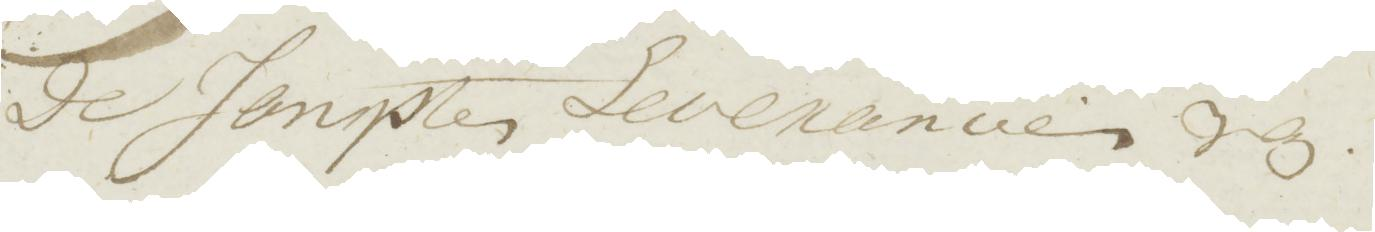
De Jonste Leverancie van.
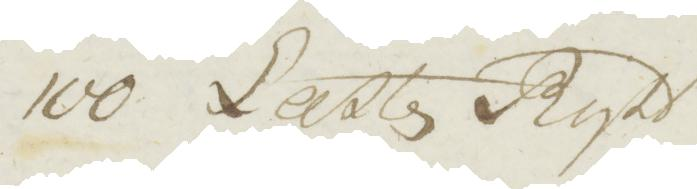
100 Lasten Ryst
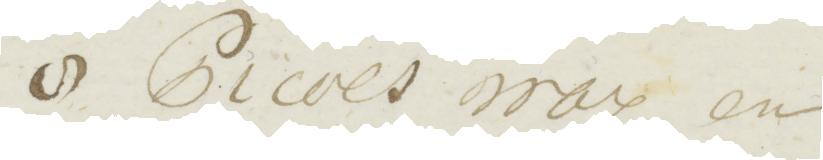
8. Picols wax en
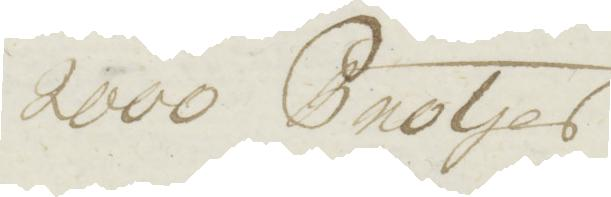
2000 Protjes
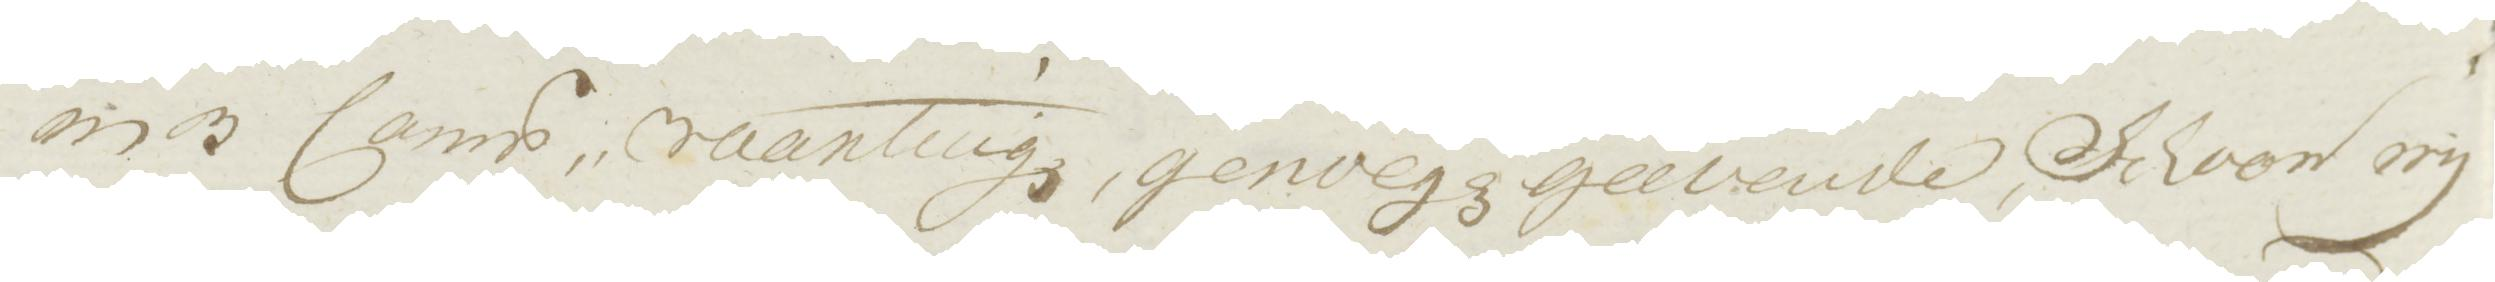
in 3 Comp„ vaartuigen, genoegen geevende, Schoon wij
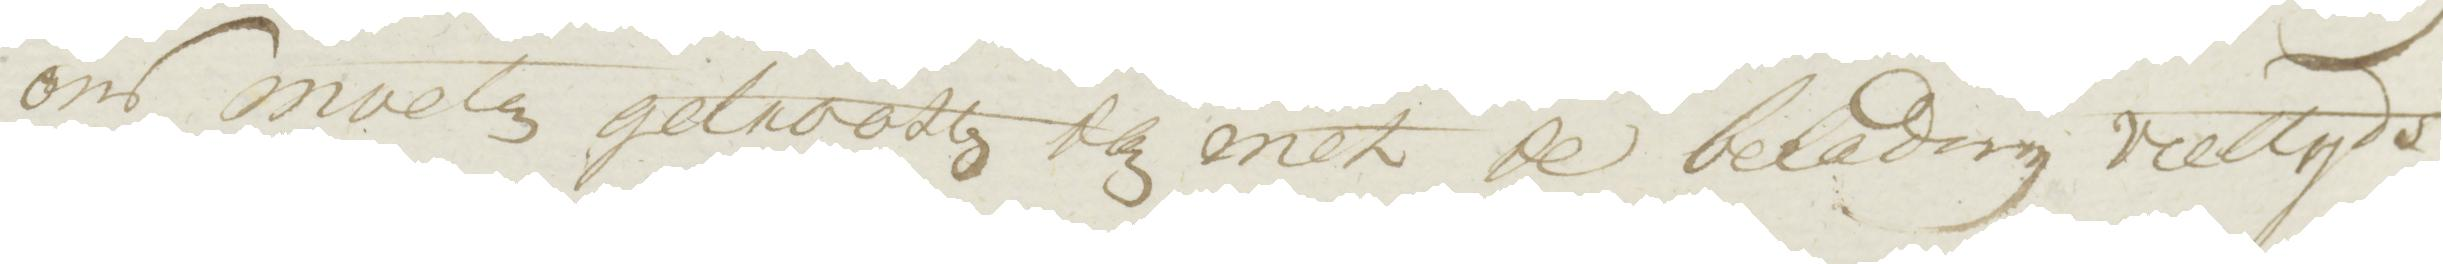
ons moeten getroosten dan met de belading veel tyds
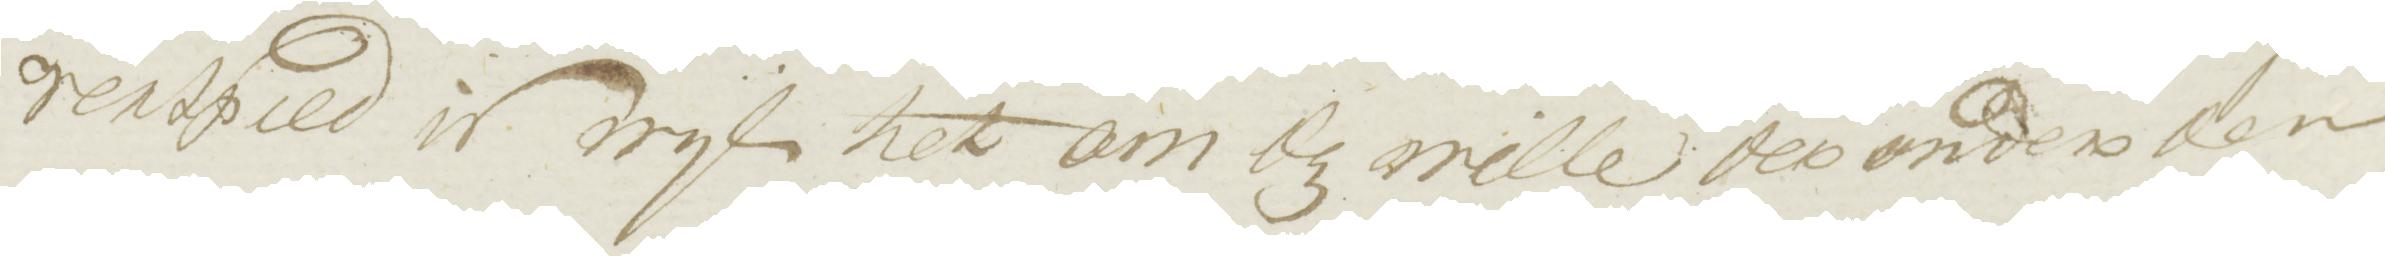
verspild is wijl het om den wille der onder den
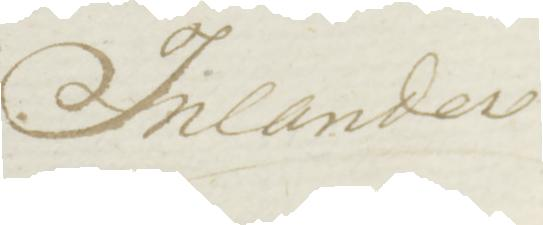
Inlander
